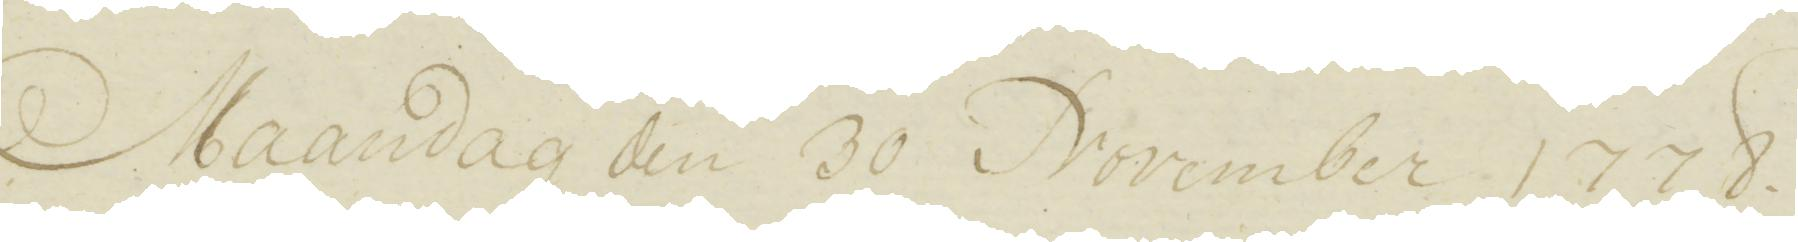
Maandag den 30: November 1778.
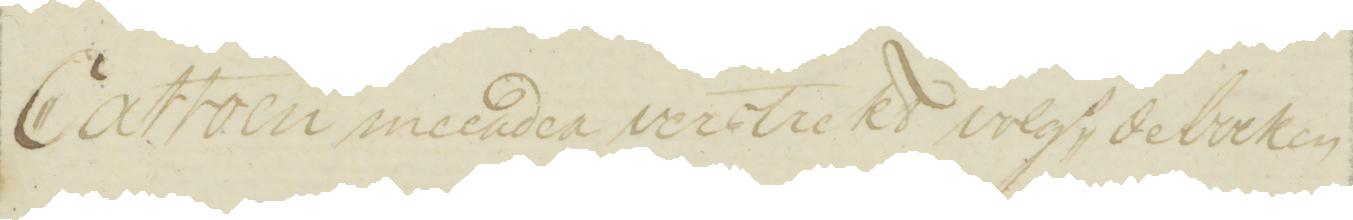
Cattoen meerder verstrekt volg„s de boeken
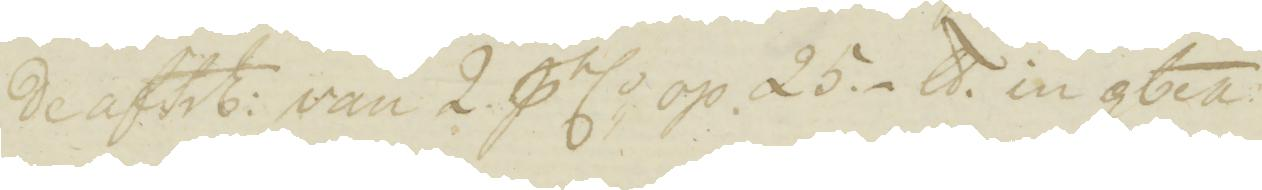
de afsch: van 2. prC„o op 25.- lb. in 9ber:
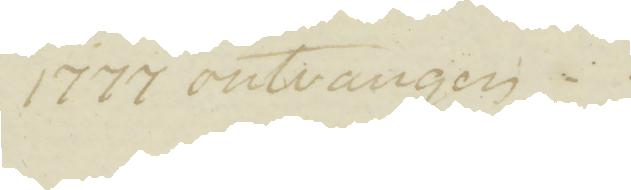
1777 ontvangen
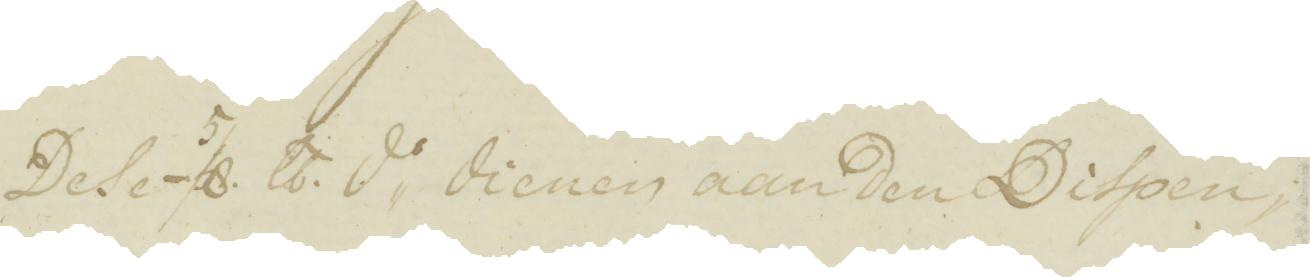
Dese 5/8 lb: d„o dienen aan den Dispen„
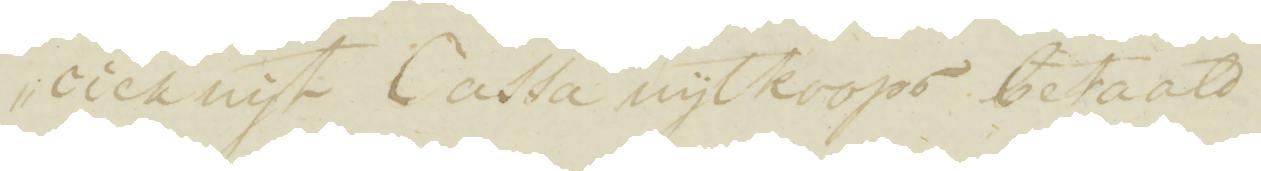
„cier uijt Cassa uijtkoops betaald
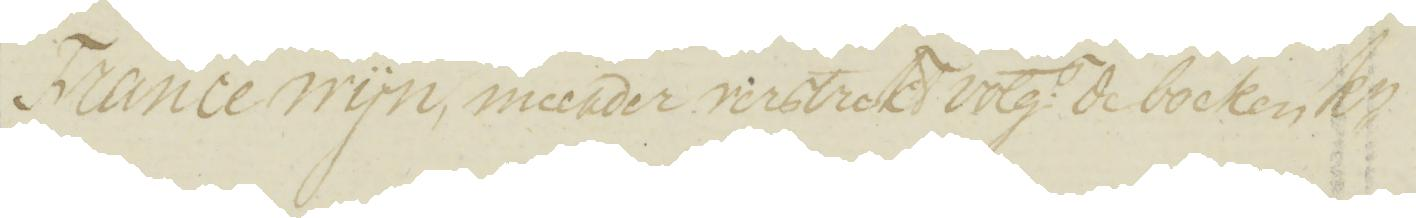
France wijn, meerder verstrekt volg:s de boeken k„n
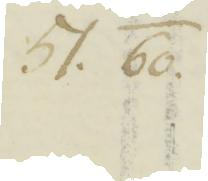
57. 53/60
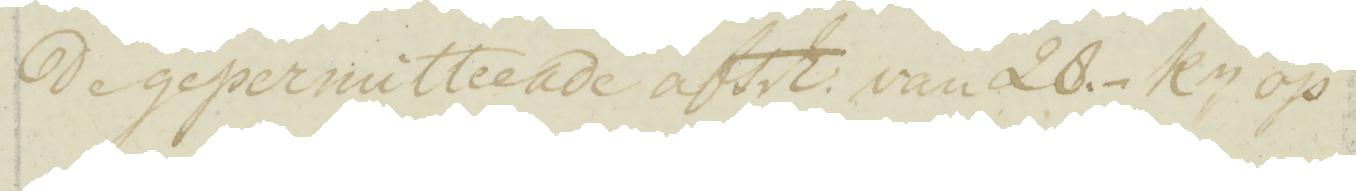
de gepermitteerde afsch: van 28.- k„n op
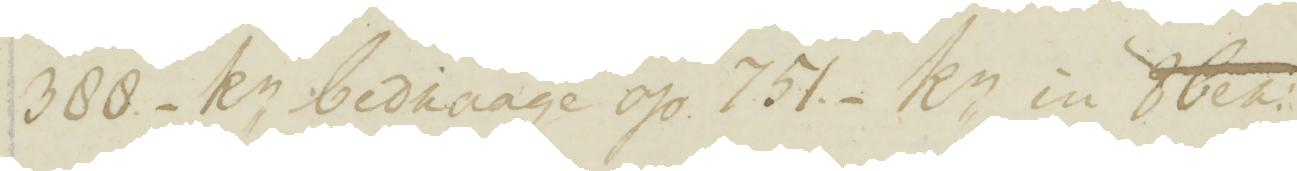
388.- k„n bedraage op 751.- k„n in 8ber:
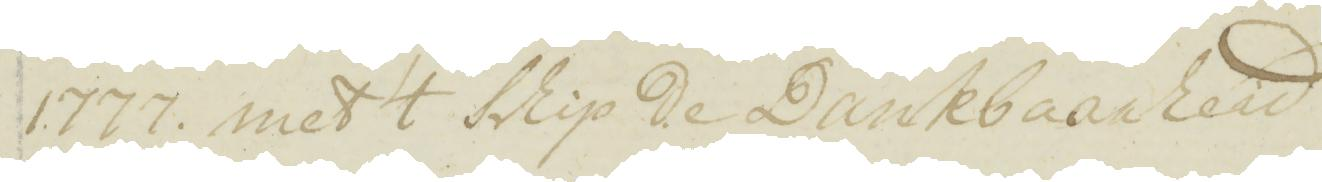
1777. met ’t schip de Dankbaarheid
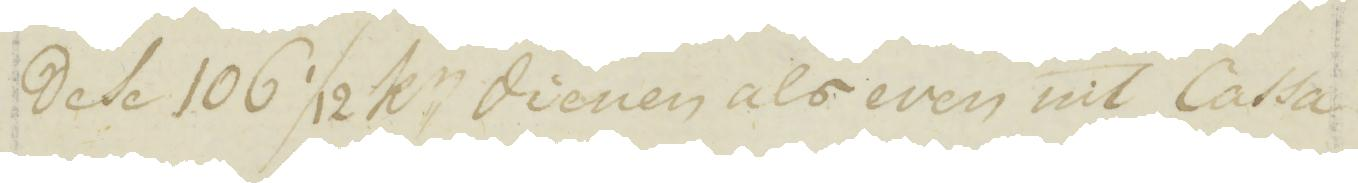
dese 106 1/12 k„n dienen als even uit Cassa
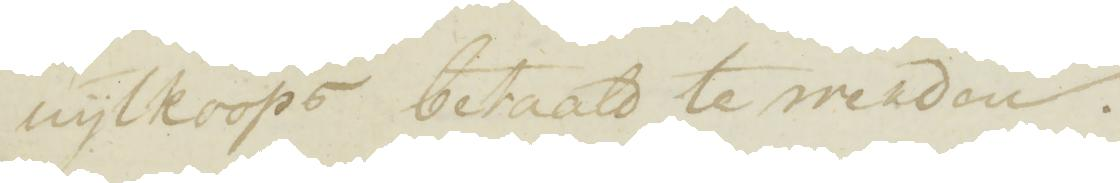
uijtkoops betaald te werden.
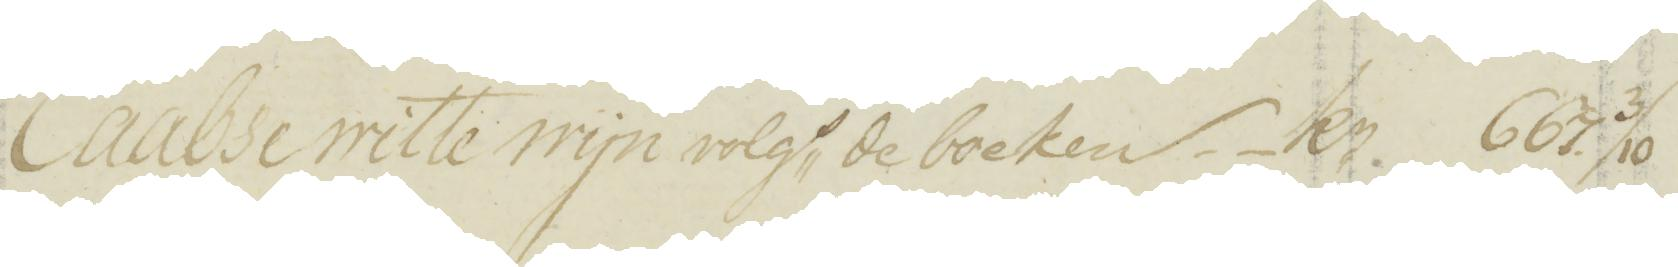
Caabse witte wijn volg„s de boeken. k„n. 667 3/10
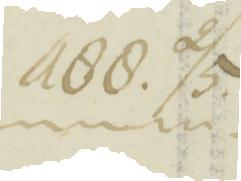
468. 2/5
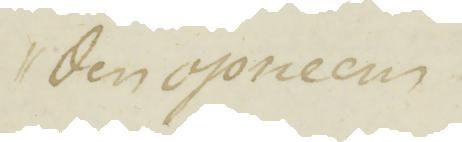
den opneem
